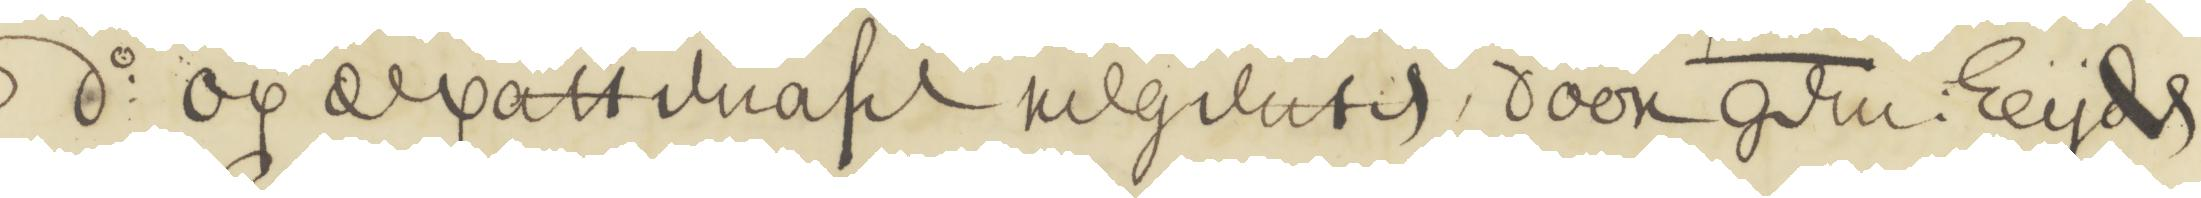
d:o op de pattenase regenten, door gem: heijden
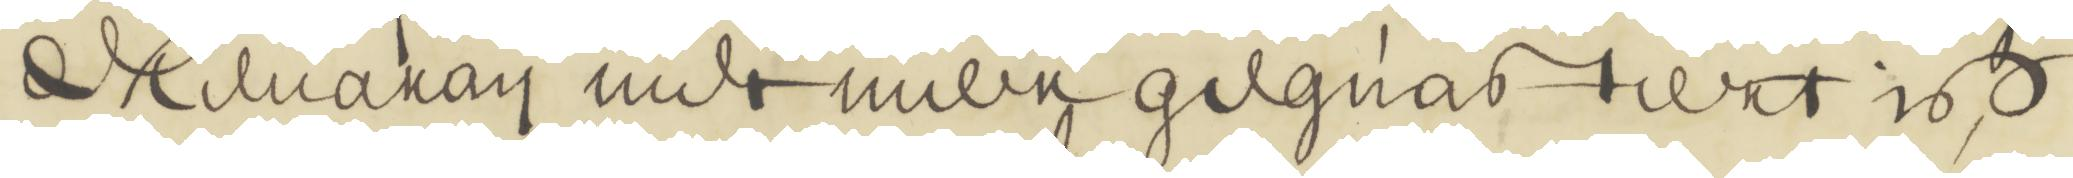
de renaraij niet meer geguasteert is,
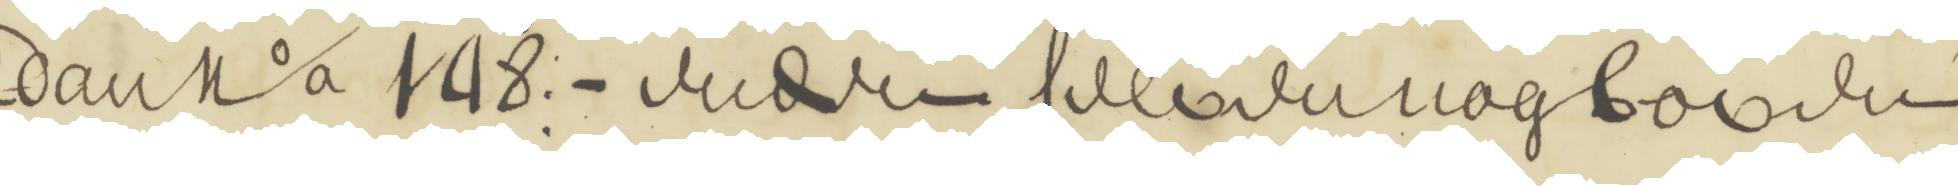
dan r o/a 148: — en den selven nog boven
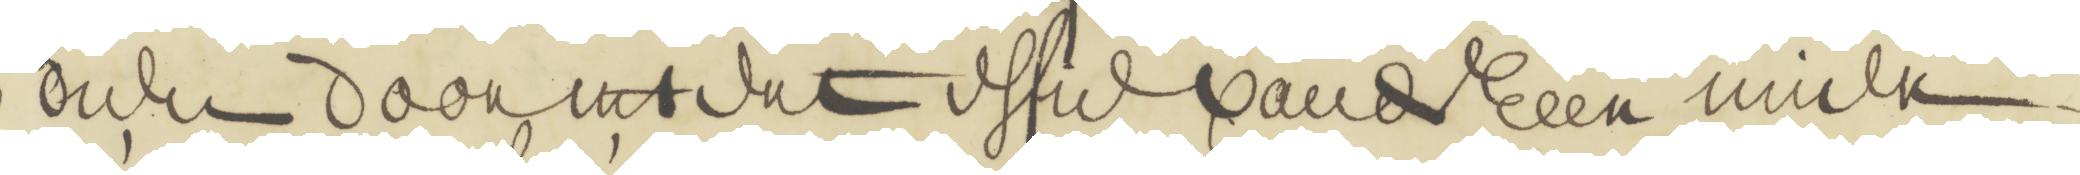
dien door intercessie vande heer mier
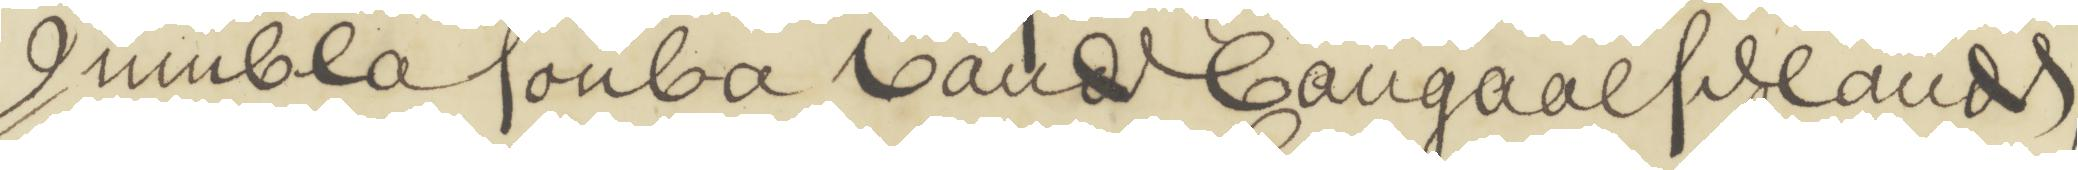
Jumbla souba vande Bangaalselanden
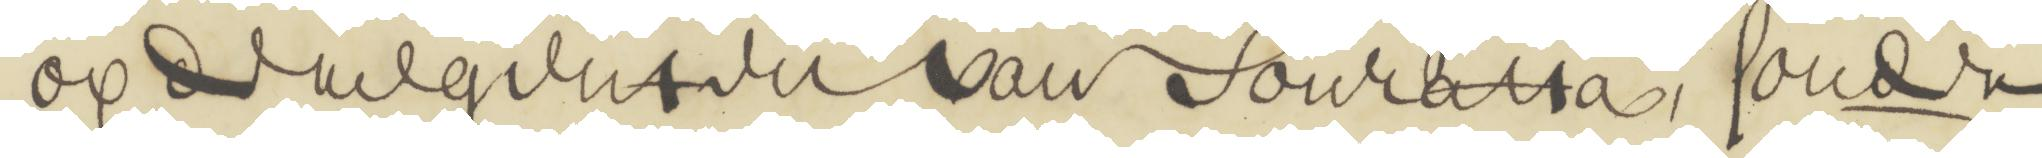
op de regenten van Souratta, sonder
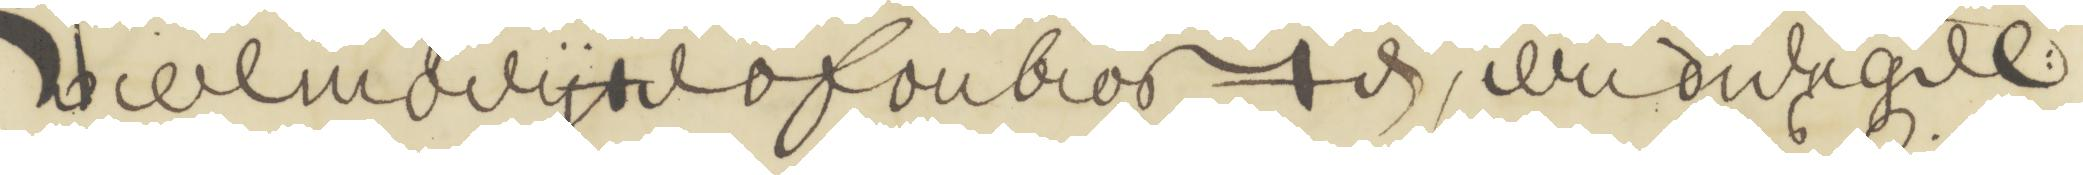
Veel moeijte of onkosten, een diergel:
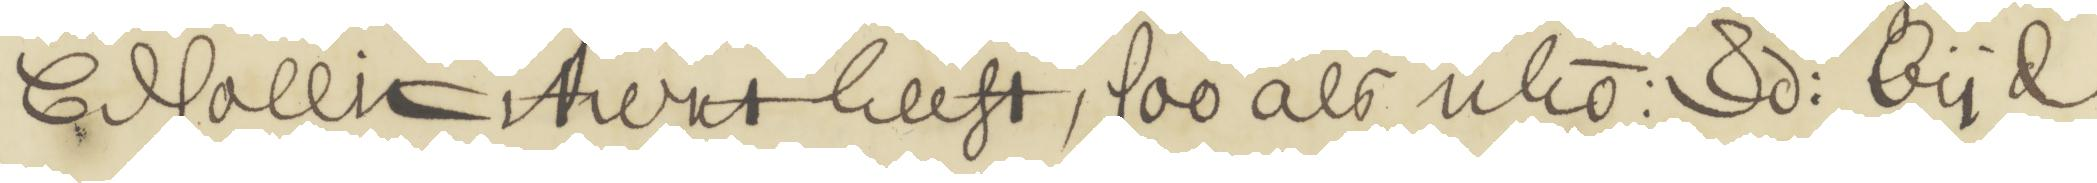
besolliciteert heeft, soo als uho: Ed:s bij de
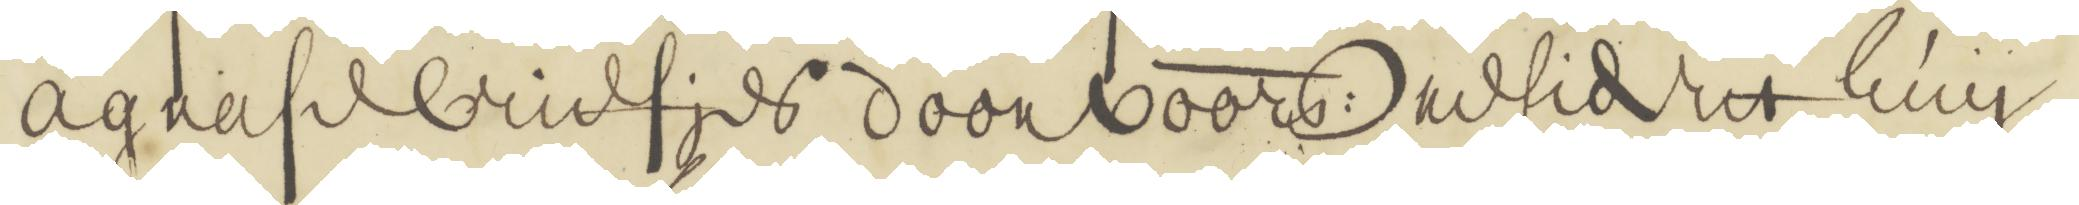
agrase briefjes door voors: resident huij
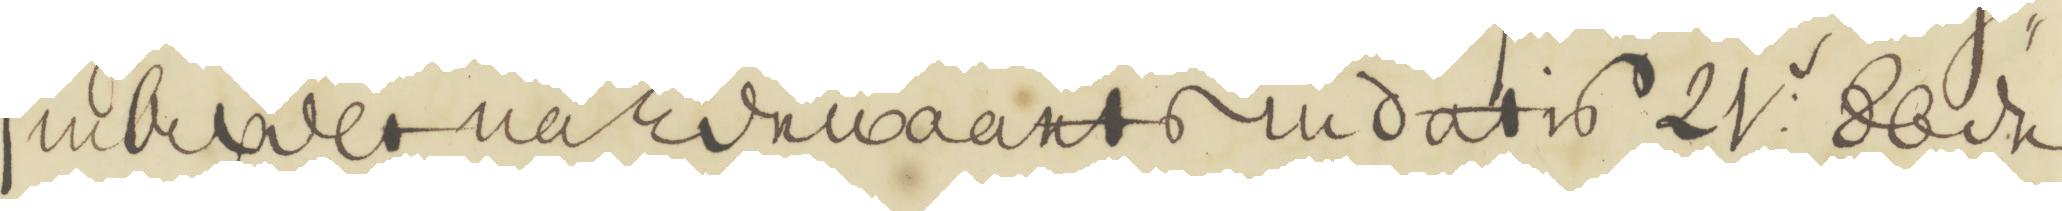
sinkvelt na herwaarts in dat is 21:e 8ber
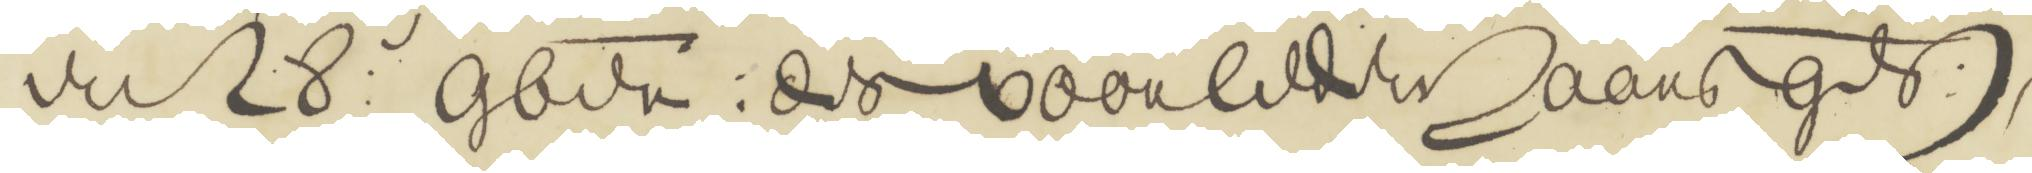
en 28:e 9ber: des voorleden Jaars ges:,
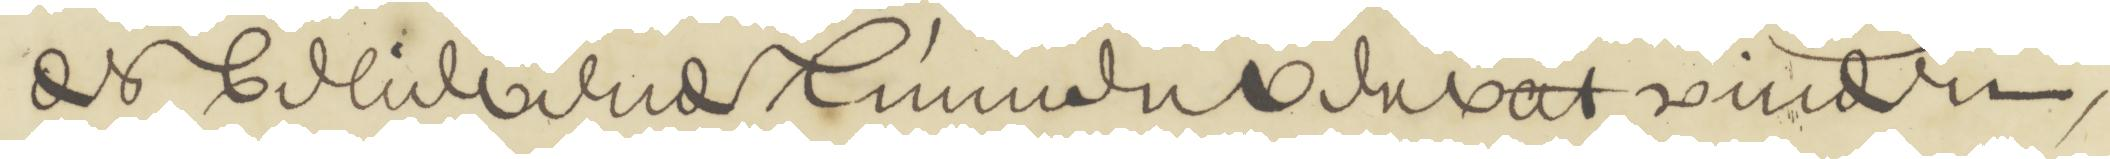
des believende kunnen vervat vinden,
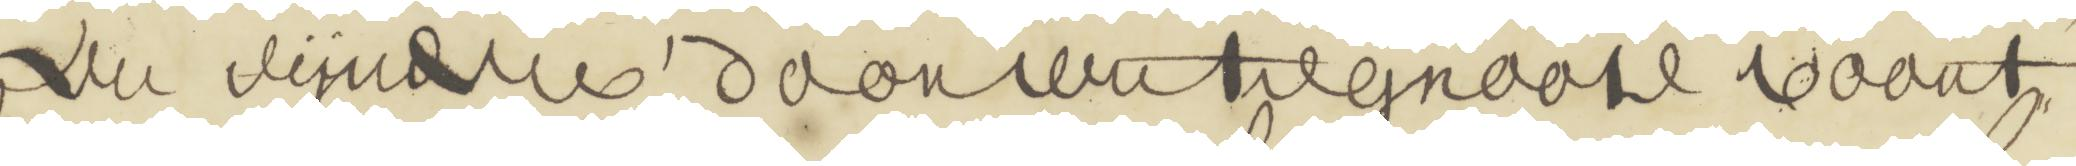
ten eijnde w' door een te groote voort„
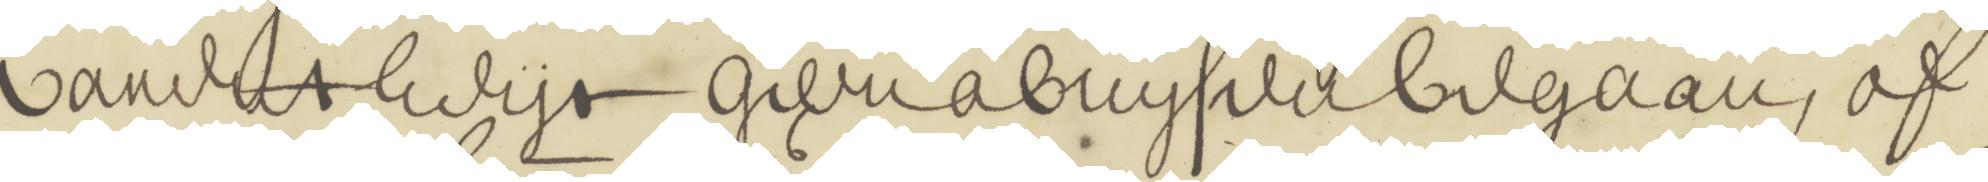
varentheijt geen abuysen begaan, of
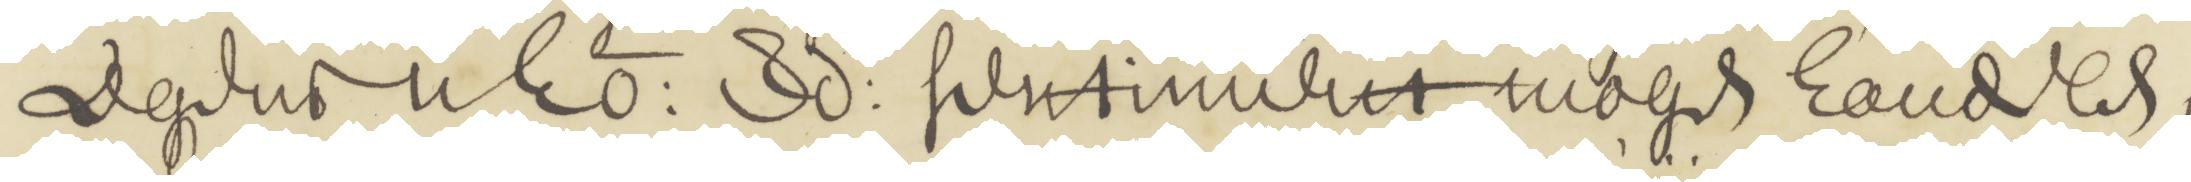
tegens uho: Ed:s sentiment mogen handelen,
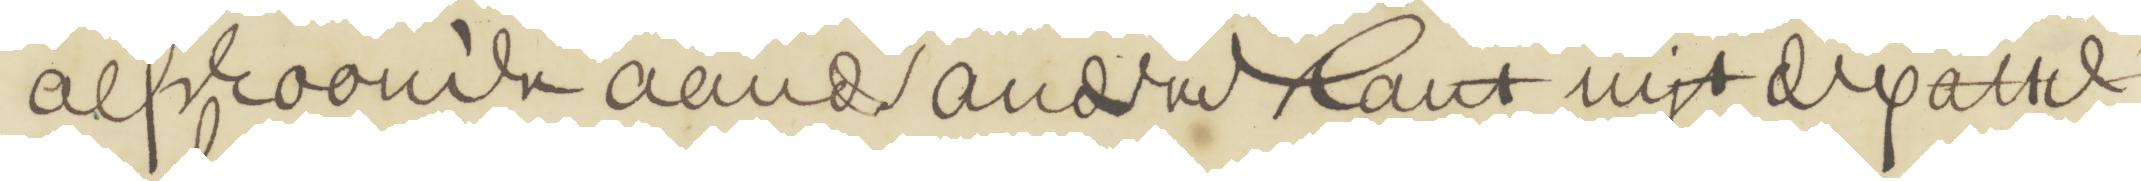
alschooner aan de andere kant uijt de patte„
